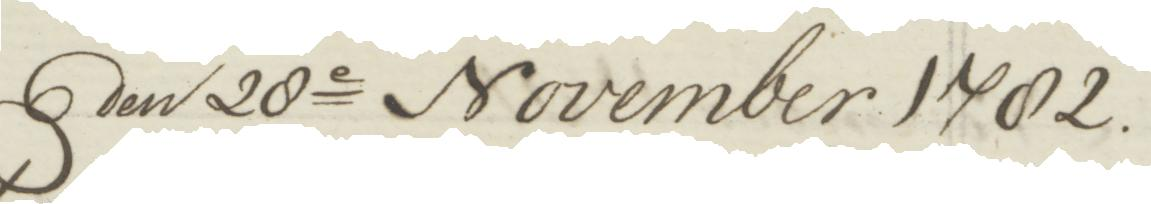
den 28=e November 1782.
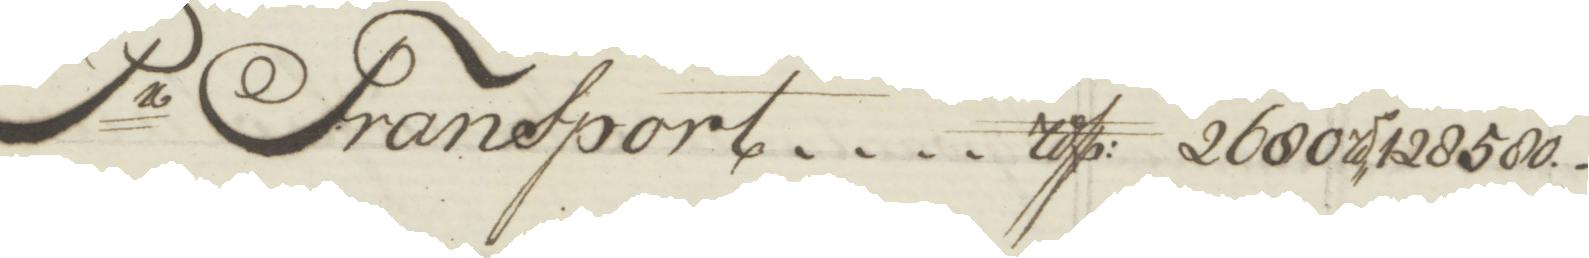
P=r Transport - - - - rdpp: 2680 rd„s 128580.
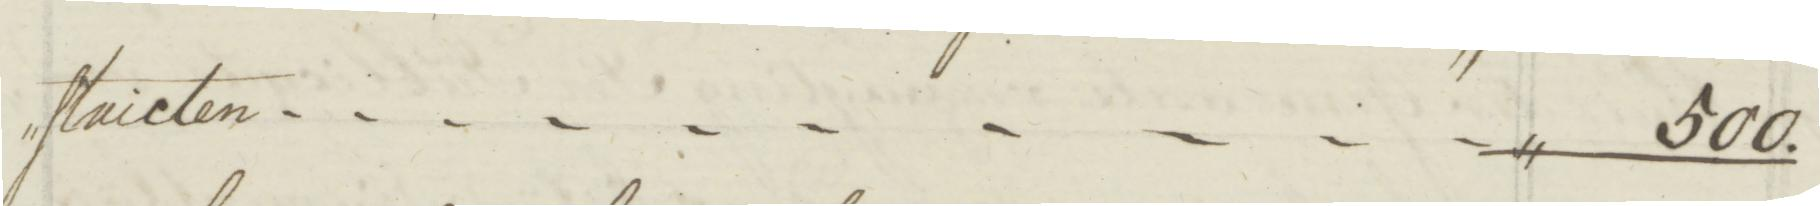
„stricten - - - - - - - - - - „ 500.
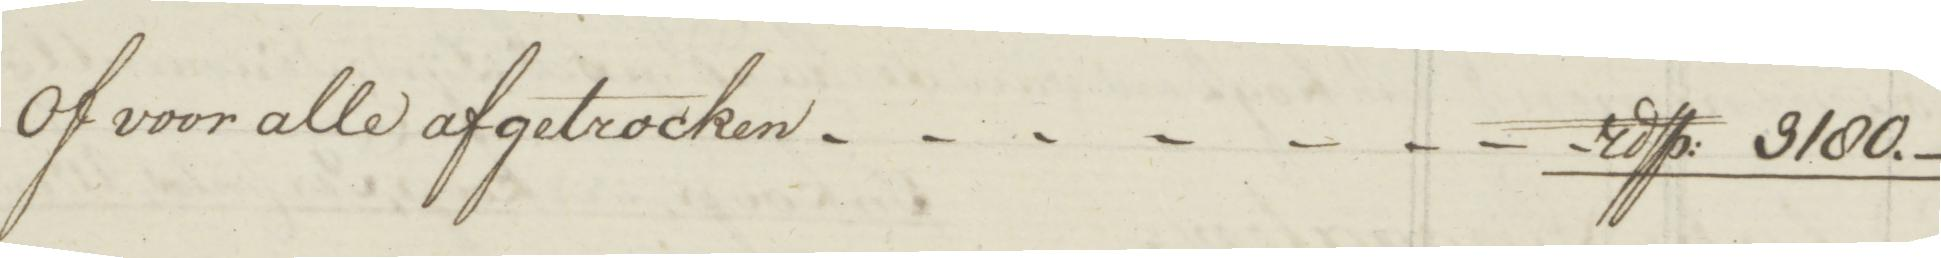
Of voor alle afgetrocken - - - - - - - - rdpp: 3180.—
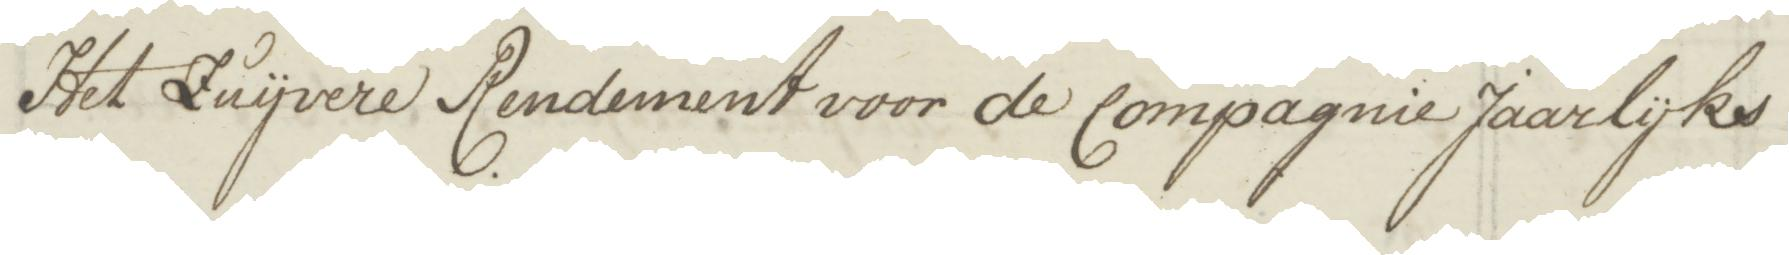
Het zuijvere Rendement voor de Compagnie Jaarlijks
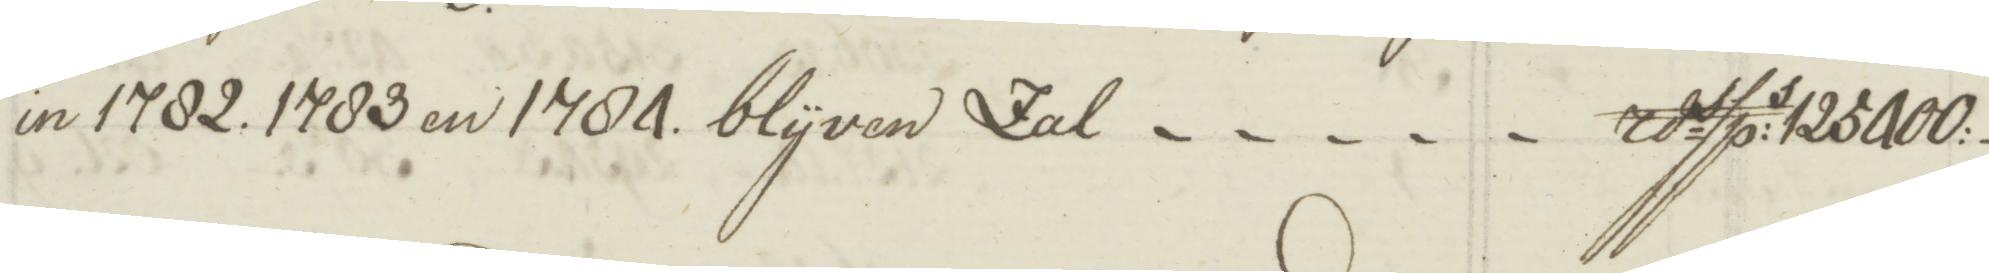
in 1782. 1783 en 1784. blijven zal - - - - - rd=s pp:s 125400:
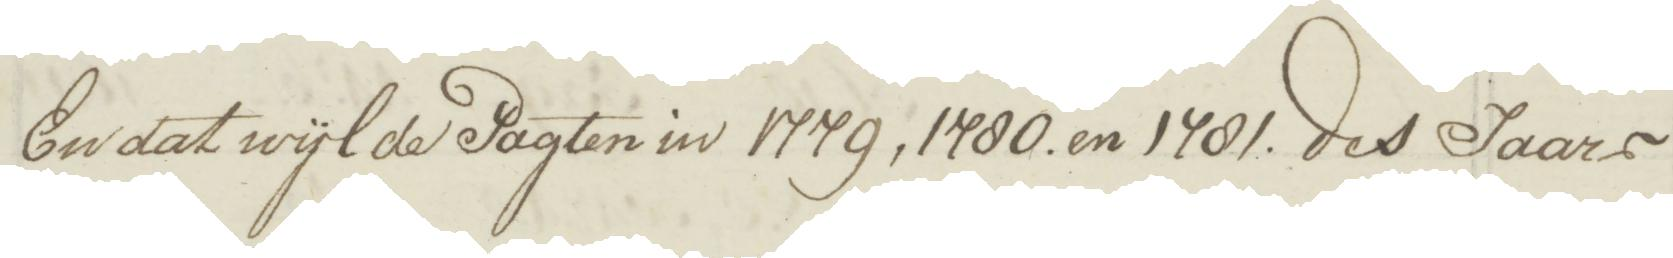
En dat wijl de Pagten in 1779, 1780. en 1781. des Jaars
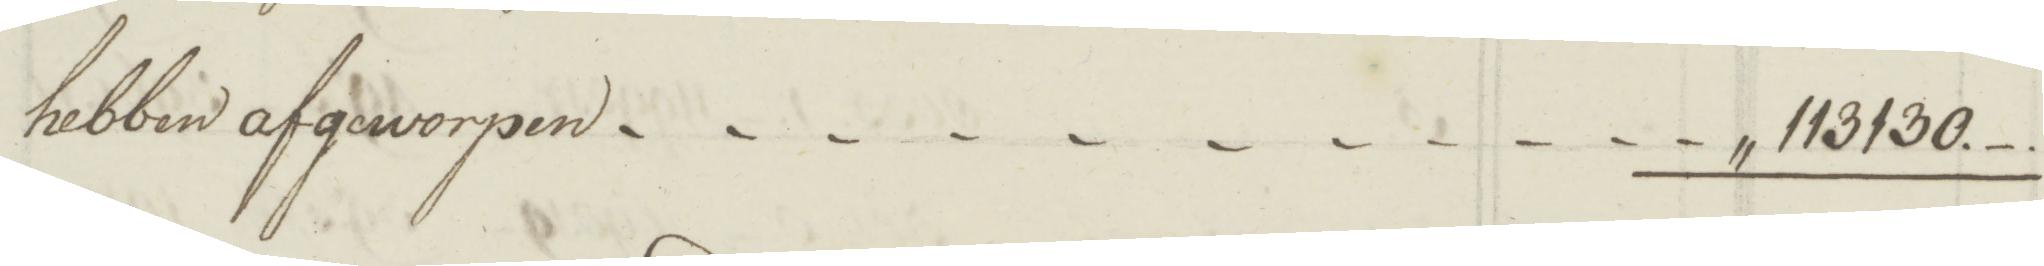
hebben afgeworpen - - - - - - - - - - - „ 113130. — .
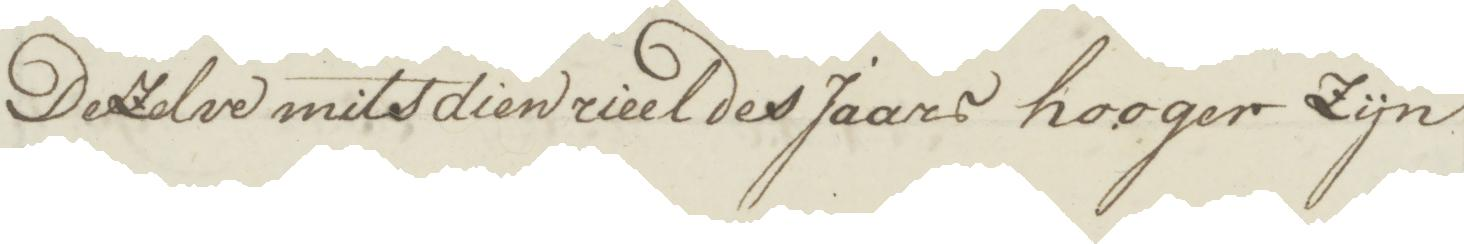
Dezelve mits dien rieel des Jaars hooger zijn
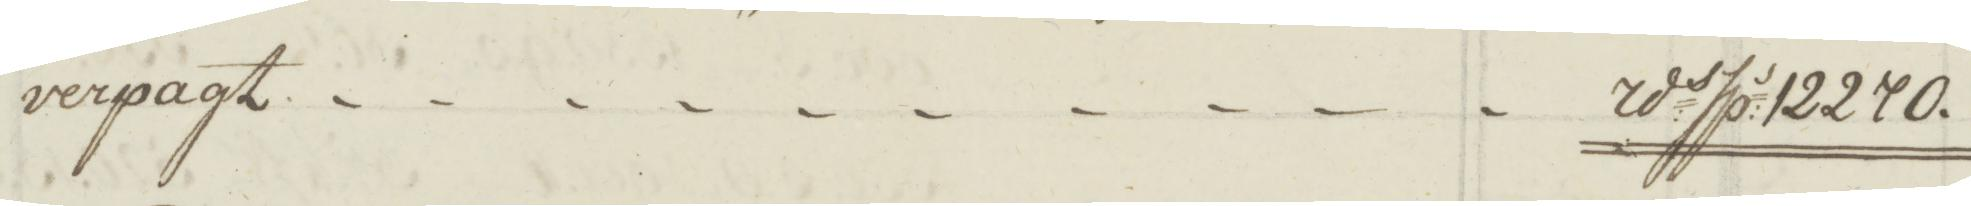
verpagt - - - - - - - - - - rd:=s pp:=s 12270.
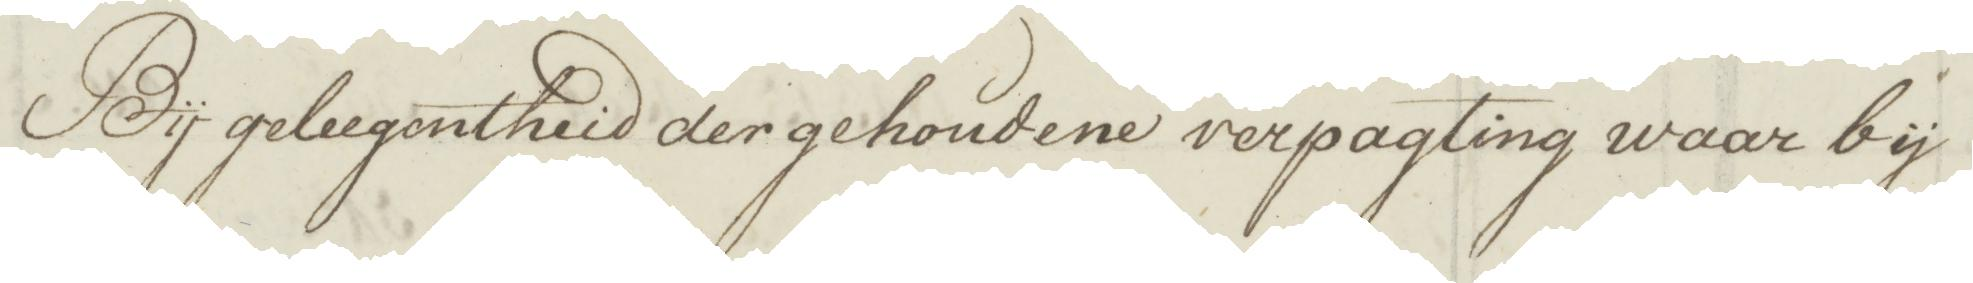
Bij geleegentheid der gehoudene verpagting waar bij
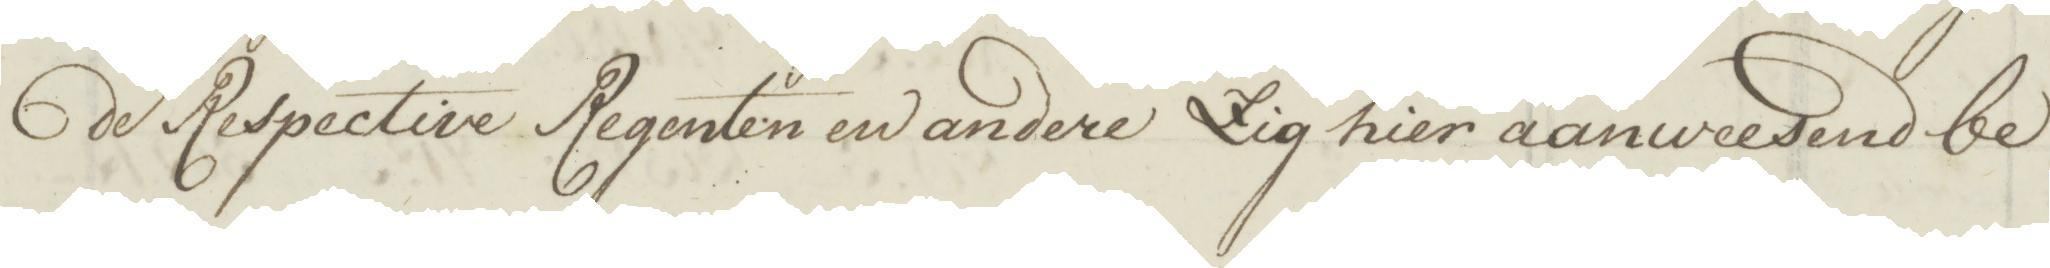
de Respective Regenten en andere zig hier aanweesend be
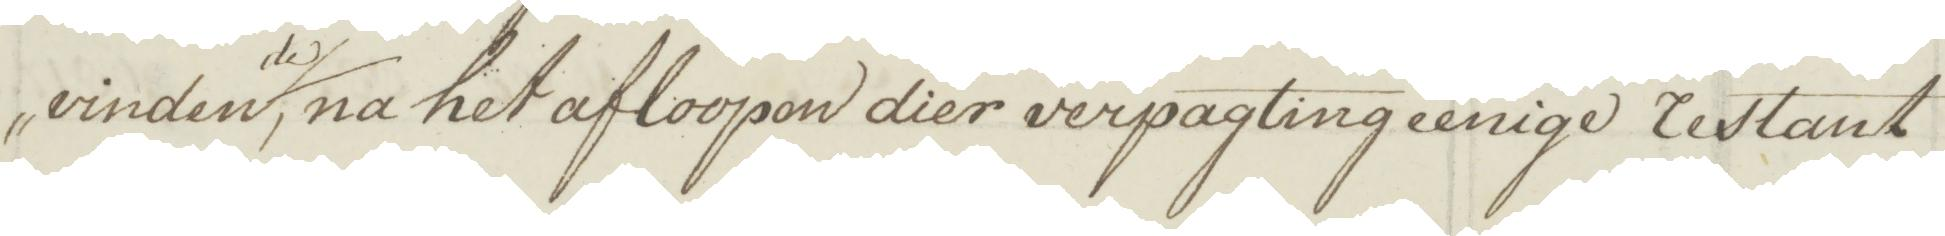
„vinden, na het afloopen dier verpagting eenige restant
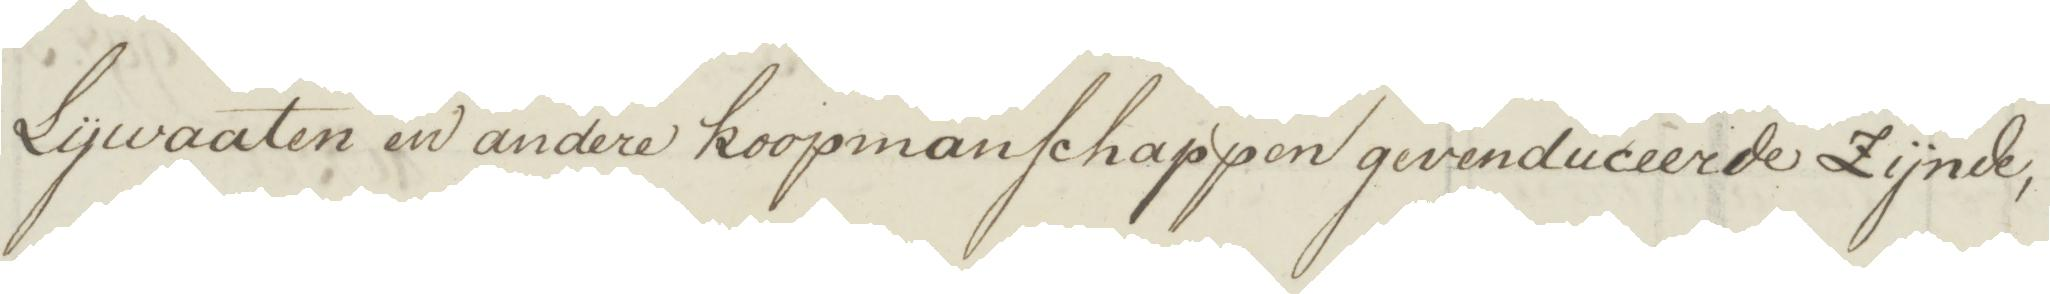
Lijwaaten en andere koopmanschappen gevenduceerde zijnde,
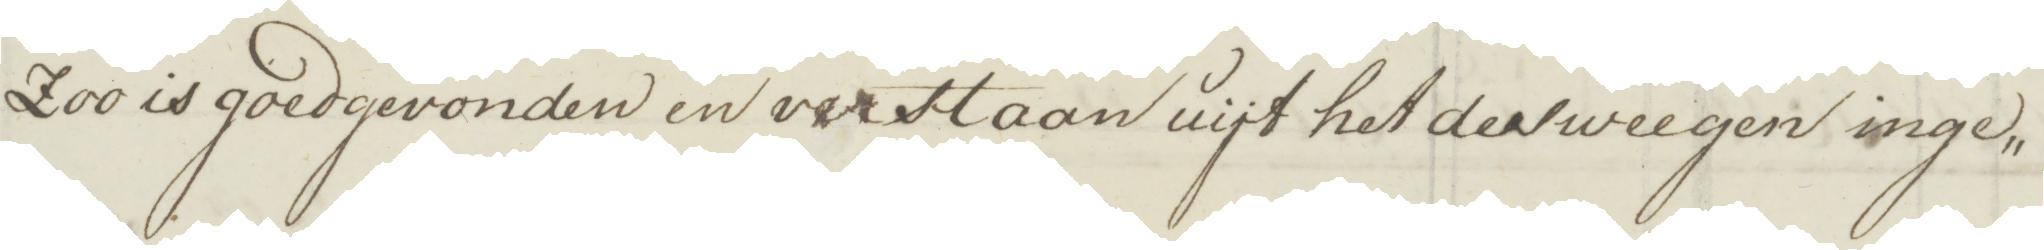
zoo is goedgevonden en verstaan uijt het desweegen inge„
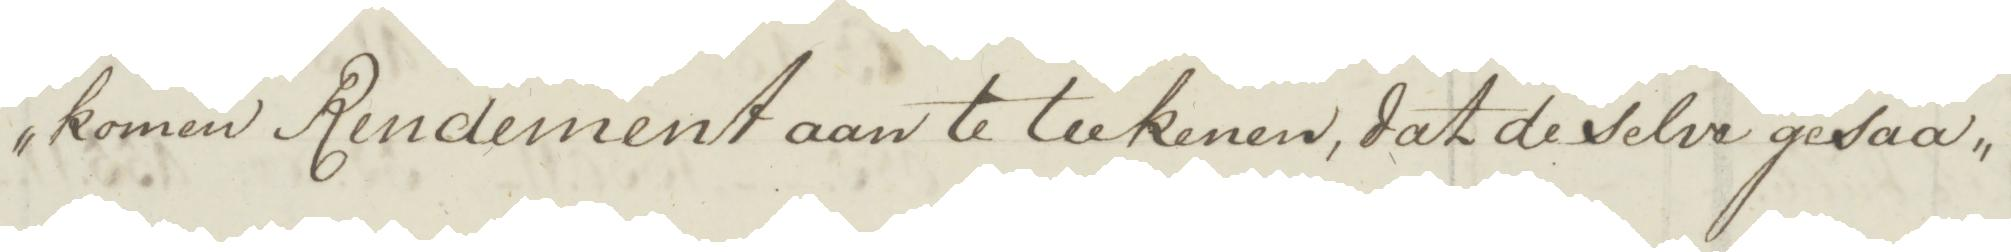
„komen Rendement aan te teekenen, dat deselve gesaa„
